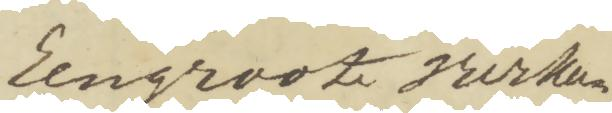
Een groote vierkan.
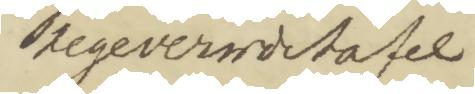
te geverwde tafel
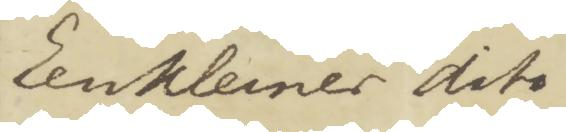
Een kleiner dito
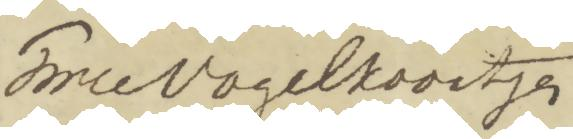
Twee vogelkooitjes
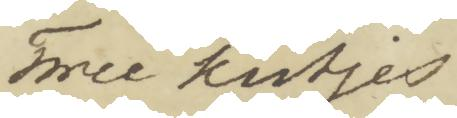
Twee kutjes
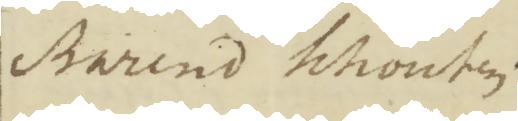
Barend schouten
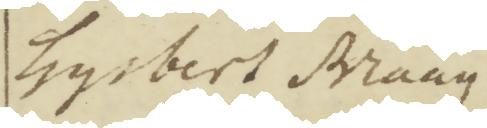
Gysbert Braay
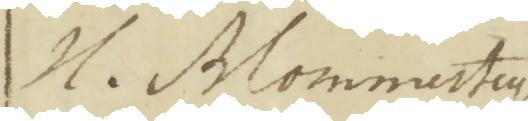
H. Blommesteyn
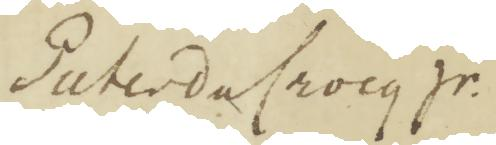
Pater da Crocq jr.
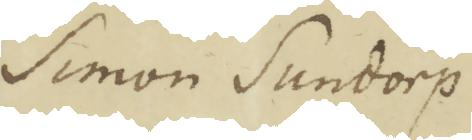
Simon Sundorp
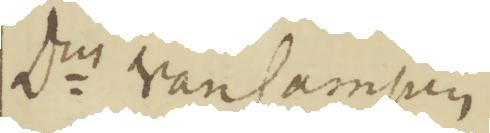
D=m van Campen
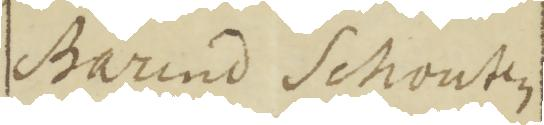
Barend Schouten
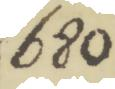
680
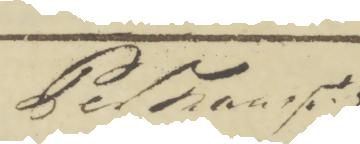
Per Transp.t
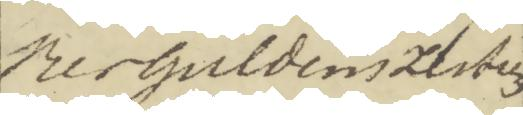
Vier Guldens zestien
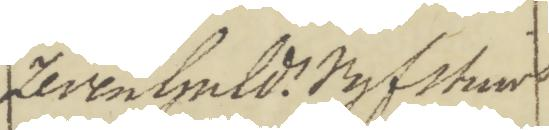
zeven Guld.s Vyf stuivs
